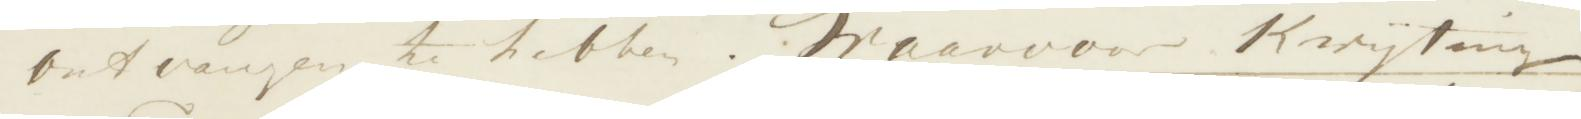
ontvangen te hebben. Waarvoor Kwijting
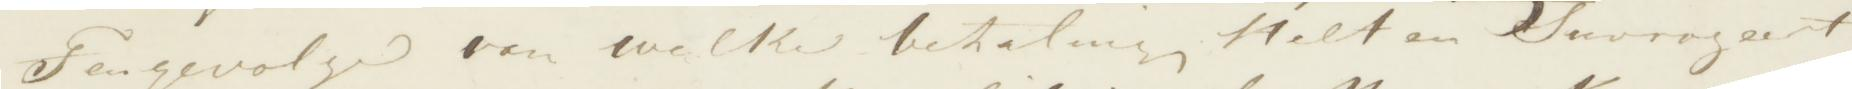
Tengevolge van welke betaling stelt en Surrogeert
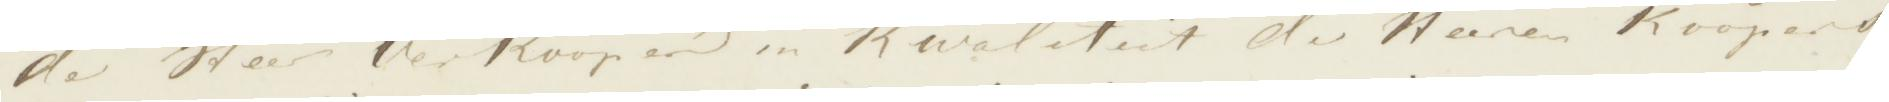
de Heer verkooper in Kwaliteit de Heeren Koopers
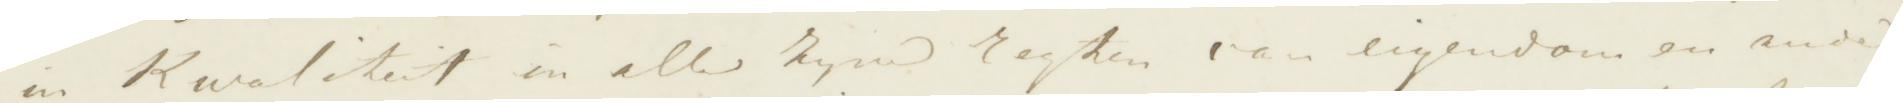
in Kwaliteit in alle Zyne Regten van eigendom en ande
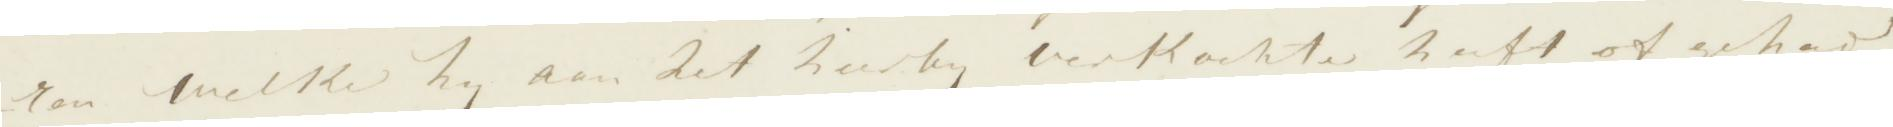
ren welke hy aan het hierby verkochte heeft of gehad
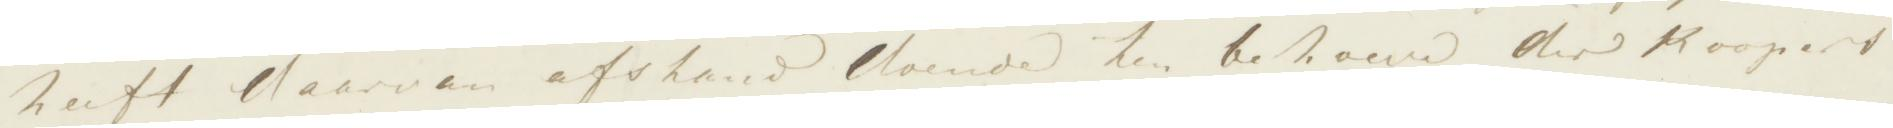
heeft daarvan afstand doende ten behoeve der Koopers
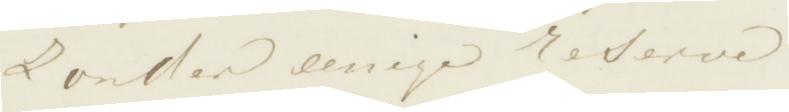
Zonder eenige reserve
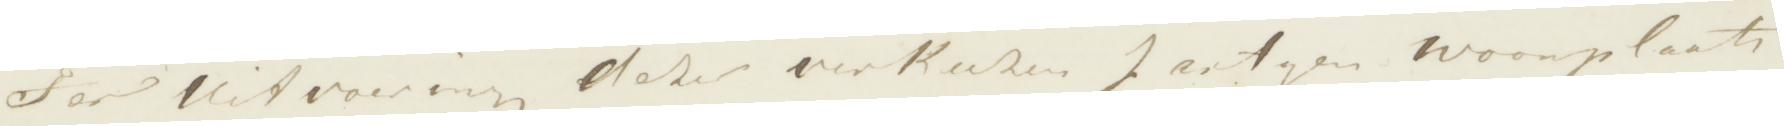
Ter Uitvoering deze verkiezen partyen woonplaats
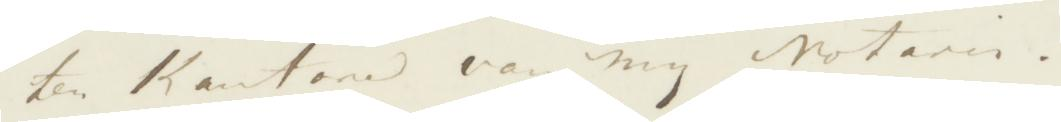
ten kantore van my Notaris.
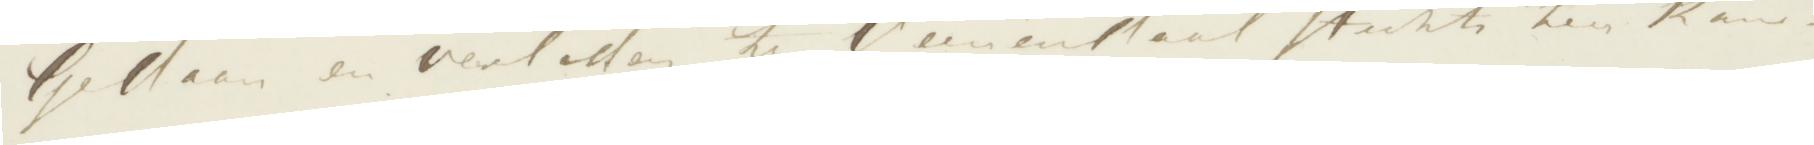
Gedaan en verleden te Veenendaal stichts ten Kan.
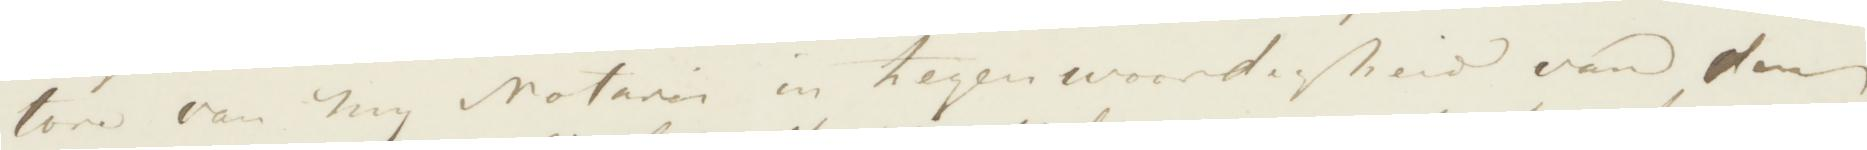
tore van my Notaris in tegenwoordigheid van den
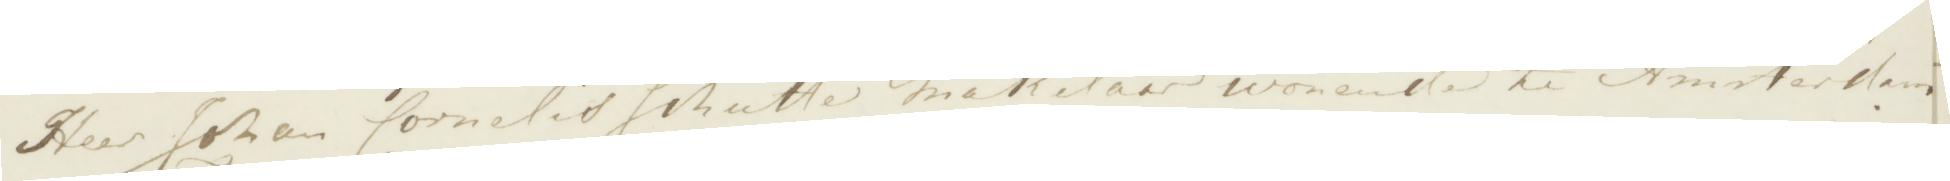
Heer Johan Cornelis Schutte makelaar wonende te Amsterdam
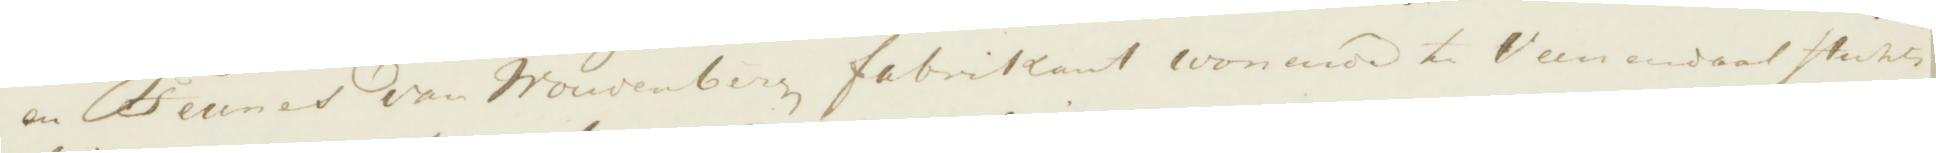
en Teunes van Woudenberg fabrikant wonende te Veenendaal stichts
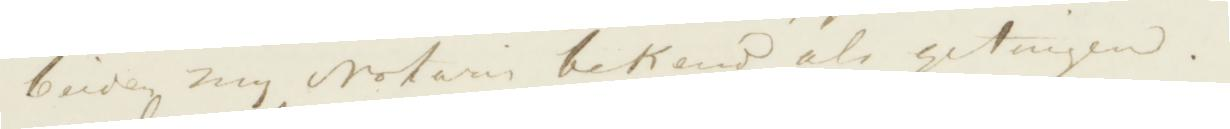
beiden my Notaris bekend als getuigen.
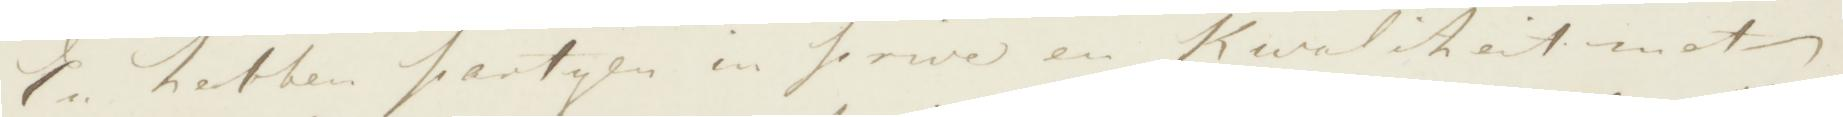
En hebben partyen in privé en Kwaliteit met
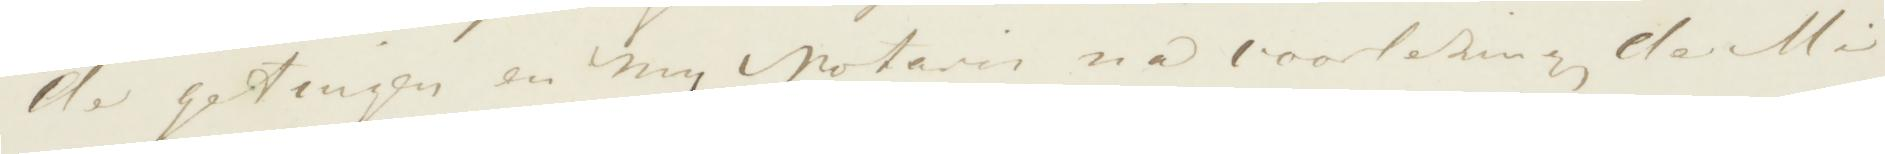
de getuigen en my Notaris na voorlezing de Mi
